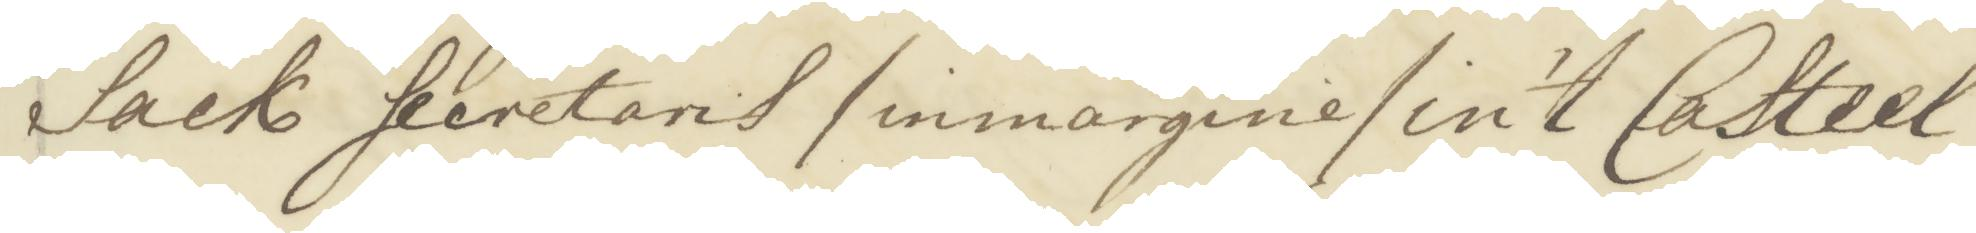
sack secretaris /in margine/ in't Casteel
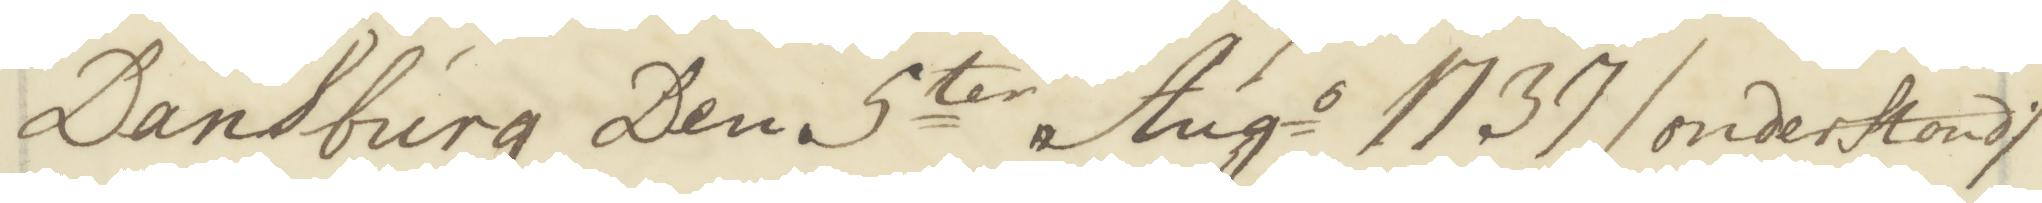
Dansburg Den 5=ter Aug=o 1737 /onderstond:/
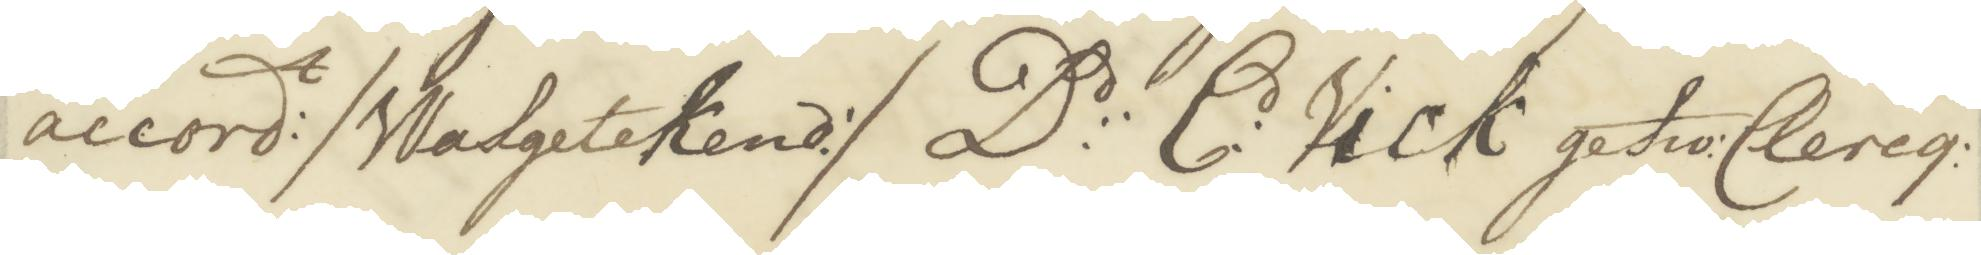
accord:t / Was getekend:/ D:d C:d Vick gesw: Clercq:
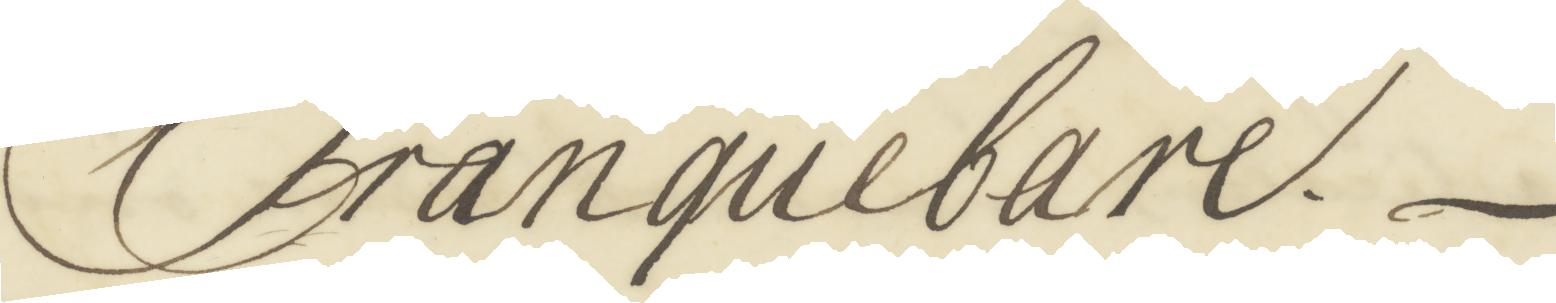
Tranquebare. —
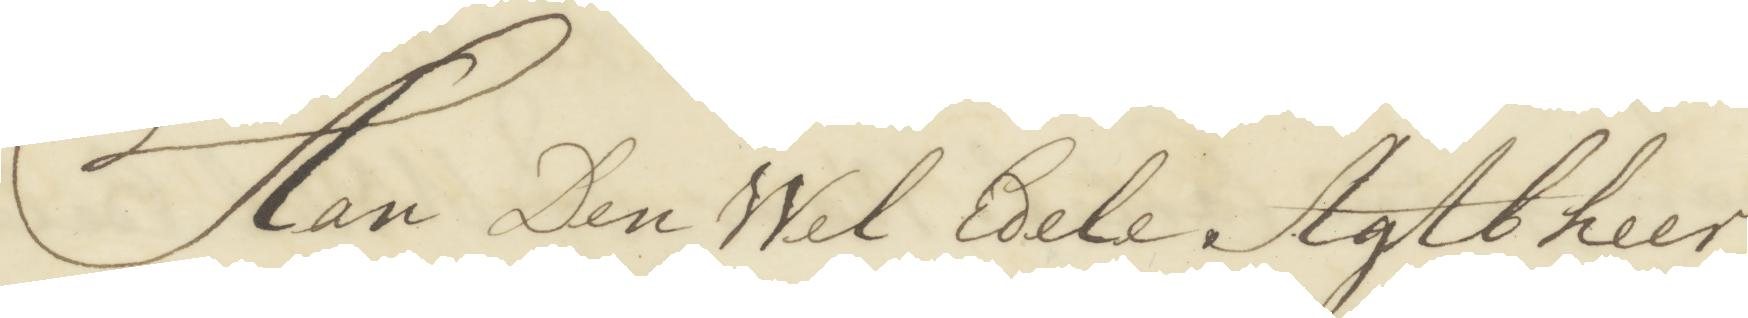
Aan Den Wel Edele Agtb heer
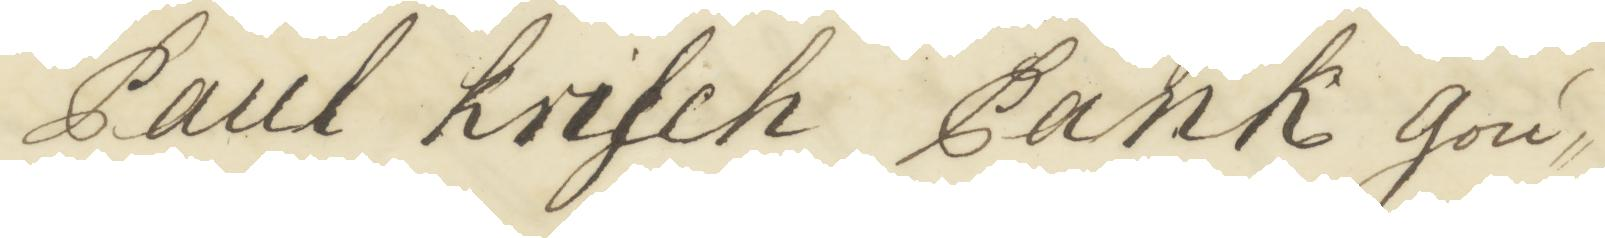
Paul krisch Pank gou„
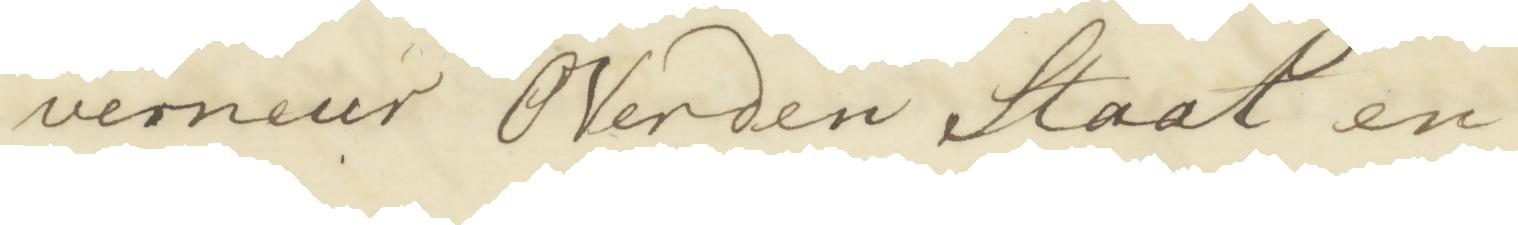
verneur over den staat en
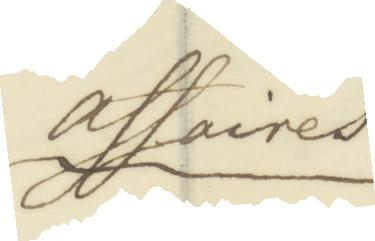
affaires
